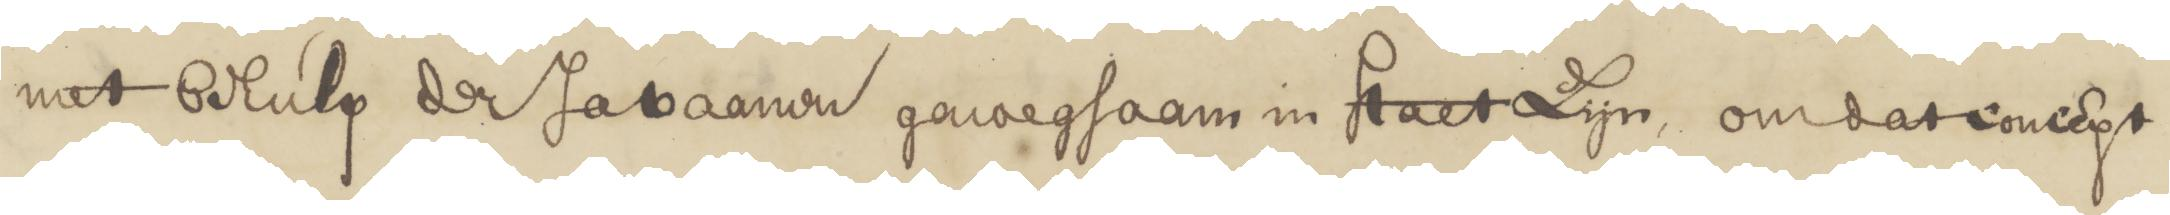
met behulp der Javaanen genoegsaam in staet zijn, om dat concept
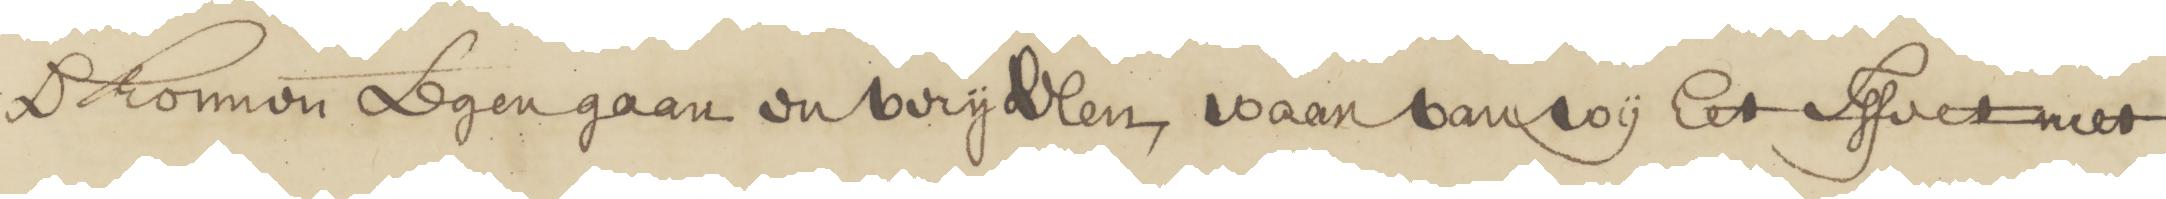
tekonnen tegen gaan en verijdelen, waar van wij het Effect met
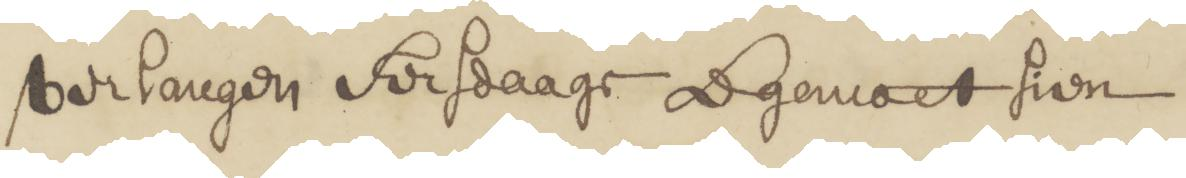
verlangen Eersdaags tegemoet sien
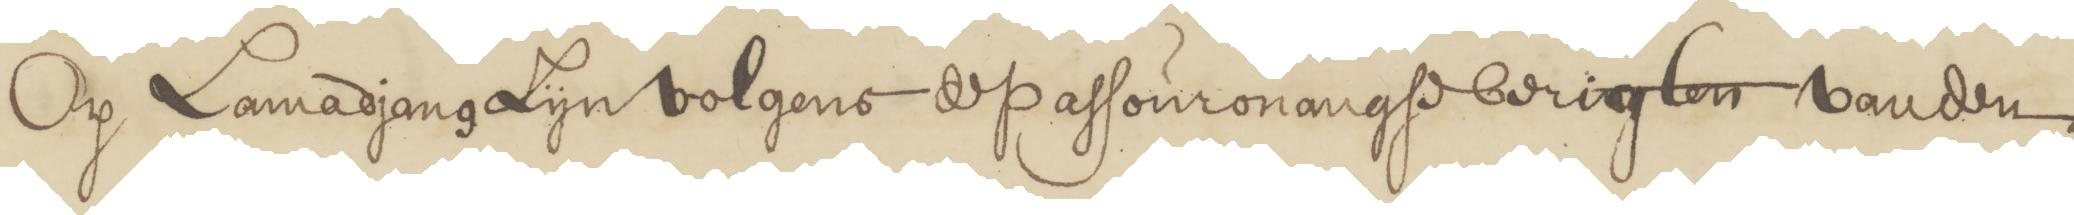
Op Lamadjang zijn volgens de passourouangse berigten van den
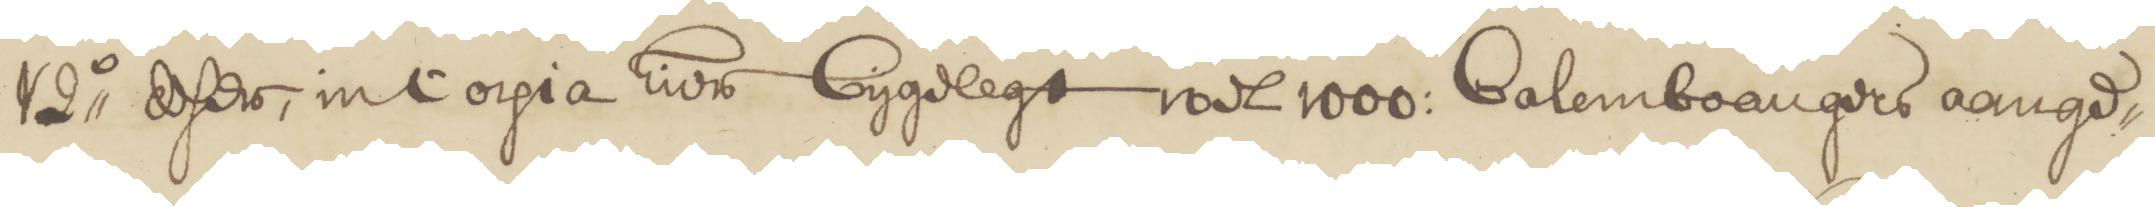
12„o deser, in copia hier bijgelegt wel 1000: balemboangers aange„
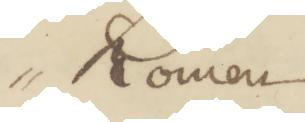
„ komen
